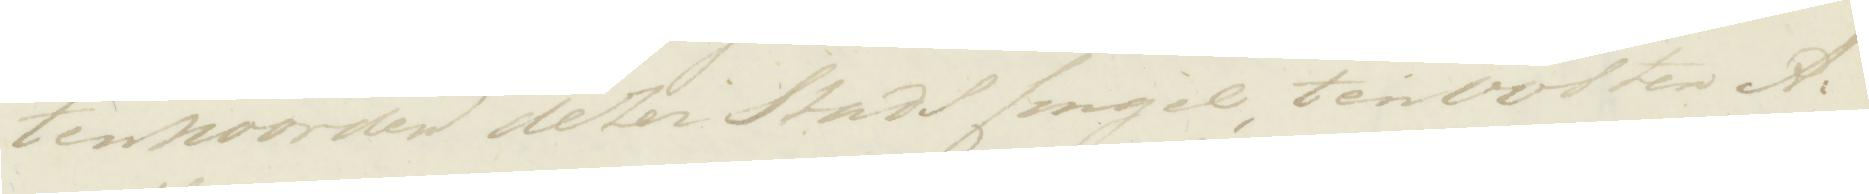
ten noorden dezer Stads Cingel, ten Oosten A:
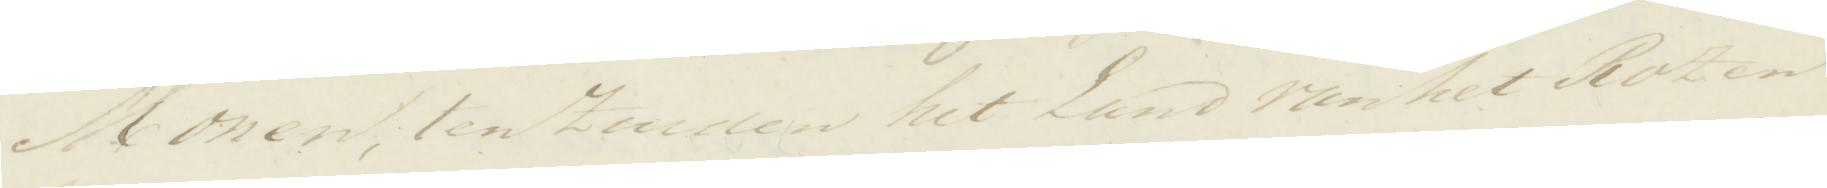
Monen, ten zuiden het Land van het Rozen
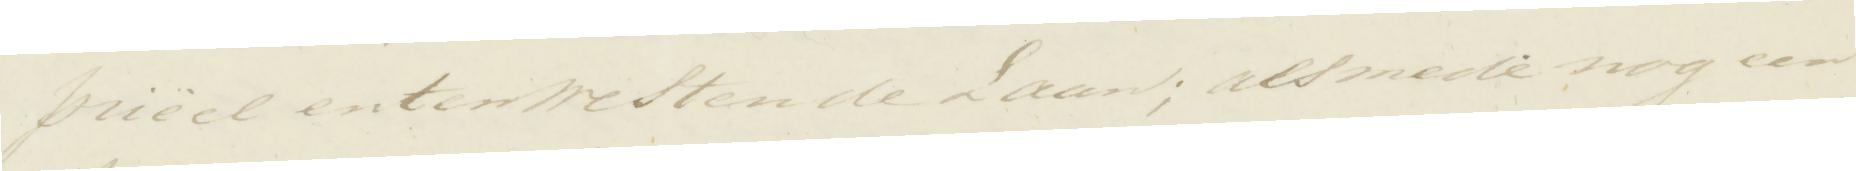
priëel, en ten westen de Laan; alsmede nog een
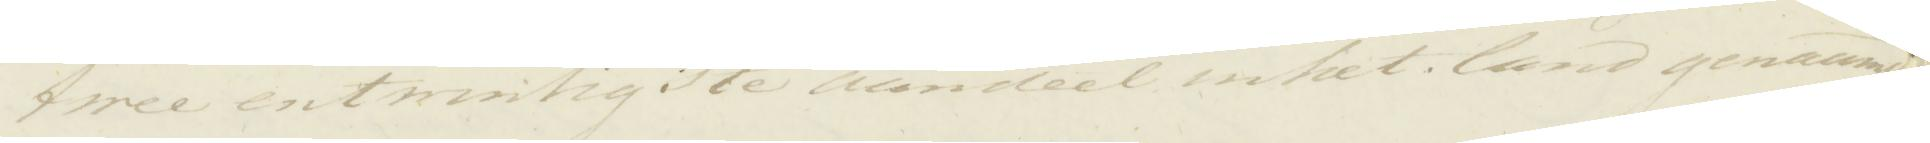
twee en twintigste aandeel in het land genaamd
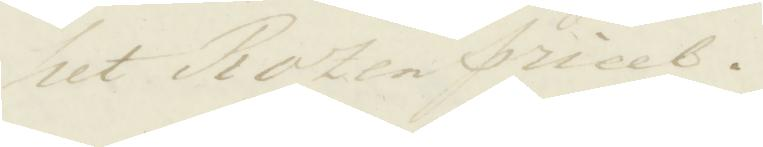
het Rozen prieel.
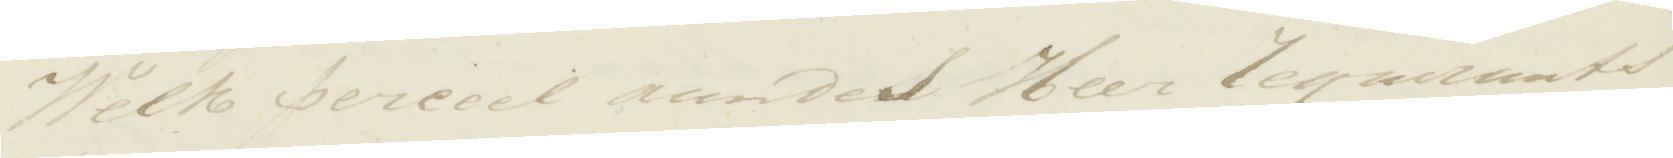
Welk perceel aan den Heer requirants
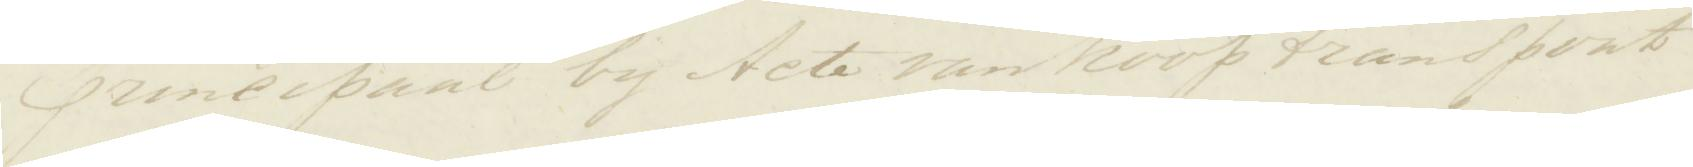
Principaal bij Acte van Koop transport
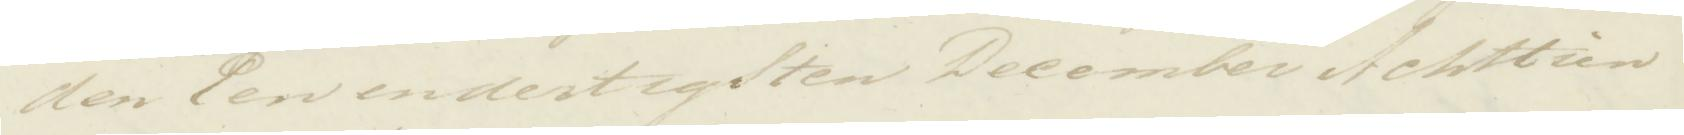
den Een en dertigsten December Achttien
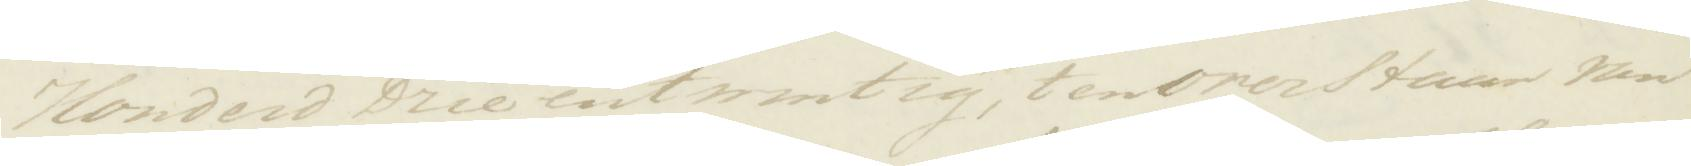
Honderd Drie en twintig, ten overstaan van
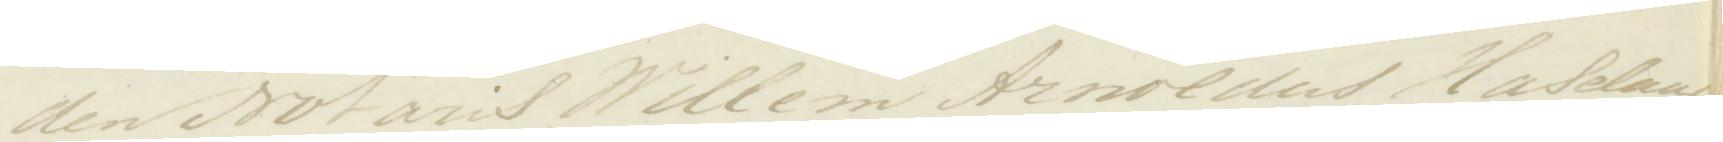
den Notaris Willem Arnoldus Haselaar
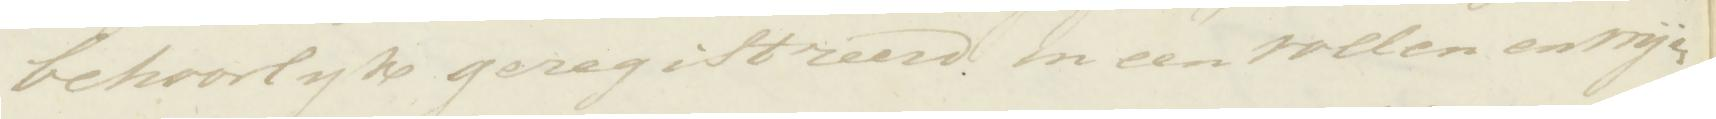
behoorlyk geregistreerd in een vollen en vrijen
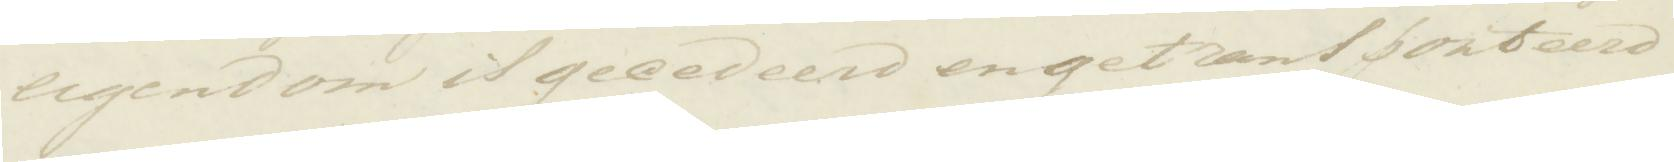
eigendom is gecedeerd en getransporteerd
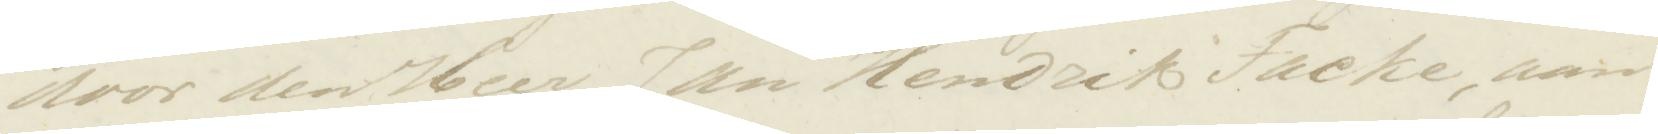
door den Heer Jan Hendrik Tacke, aan
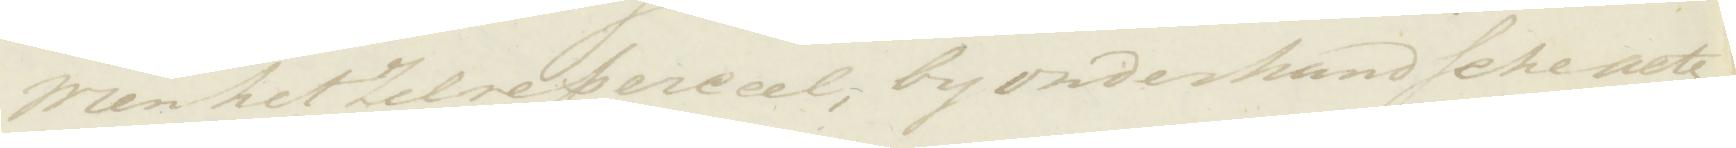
wien het zelve perceel, by onderhandsche acten
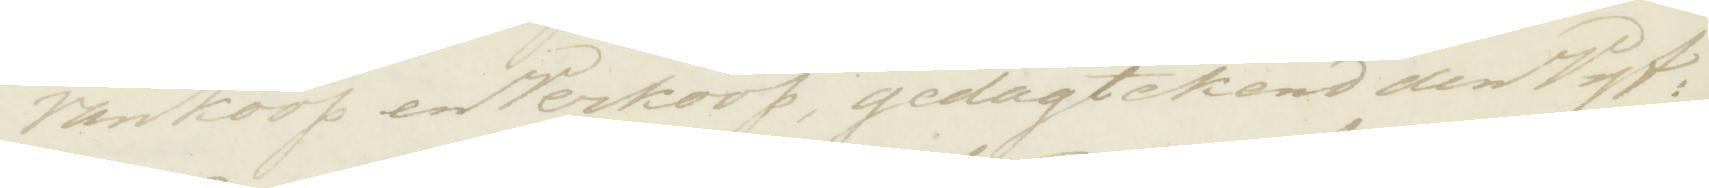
van koop en Verkoop, gedagtekend den Vyf„
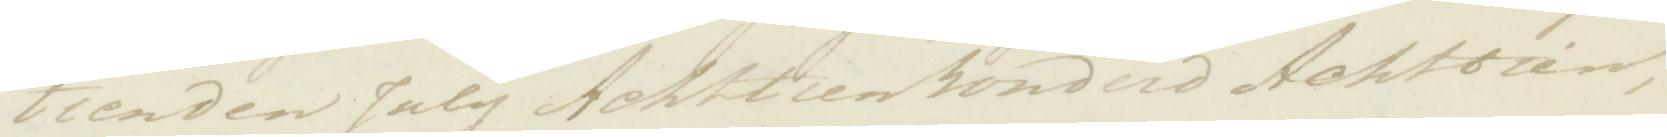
tienden July Achttienhonderd Achttien,
